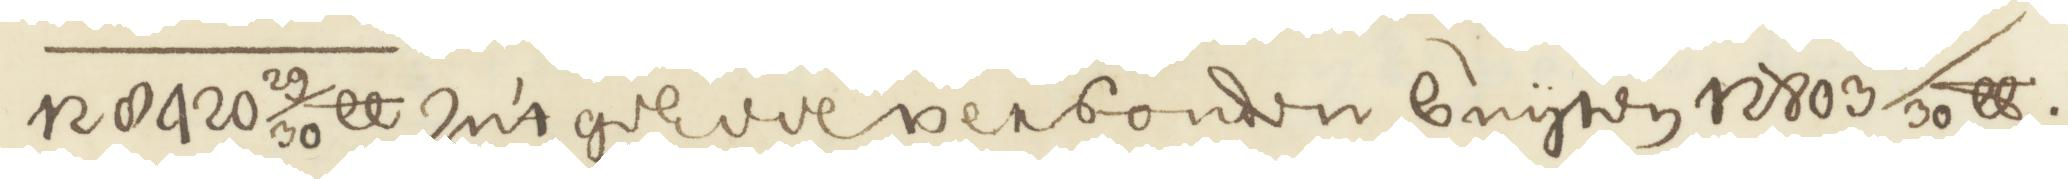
128420 29/30 lb Jn 't geheel versonden buijten 12803 23/30 lb
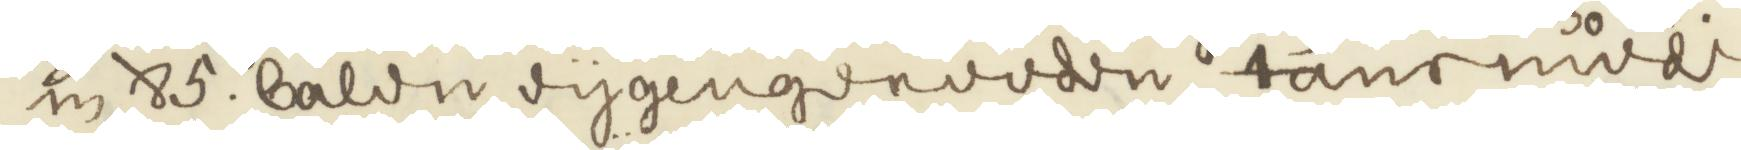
in 85. balen eijgengereeden tans mede
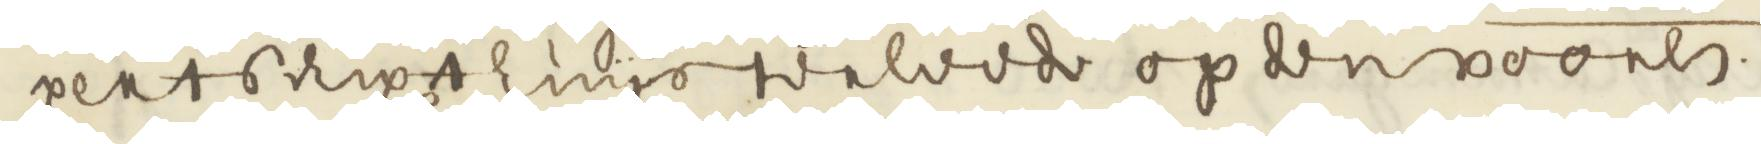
per t schip t huijs terleede op den voorl.
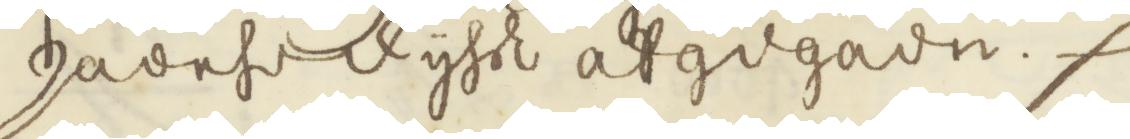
jaerse Eijsch afgegaen. —
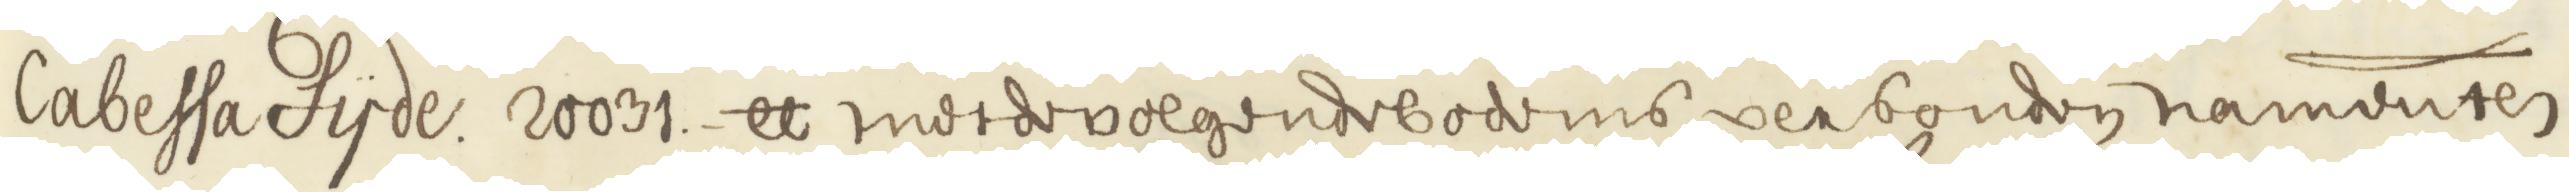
Cabessa Sijde. 20031. - lb met de volgende bodems versonden namentl
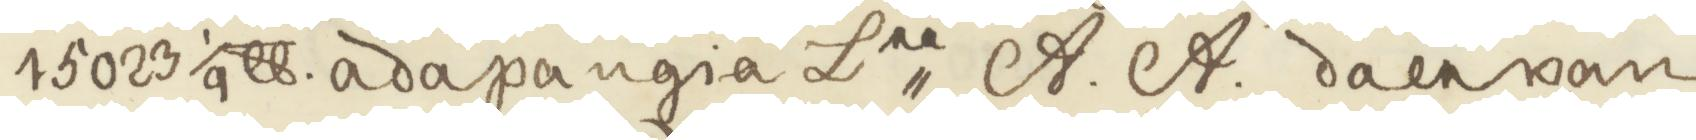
15023¼ lb. adapangia L„ra A. A. daervan
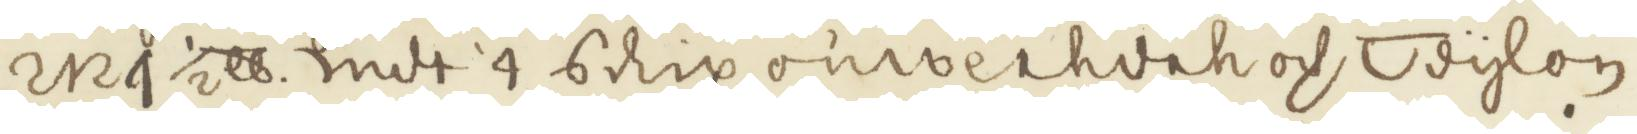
2124½ lb. met 't schip ouwerkerk over Ceijlon.
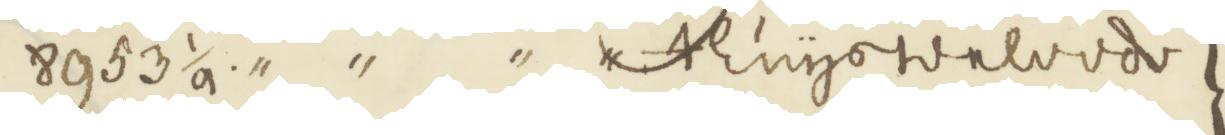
8953¼. „ „ „ „ t huijs terleede }
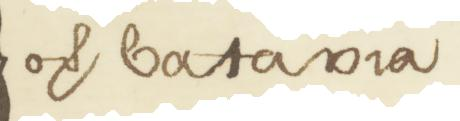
over batavia
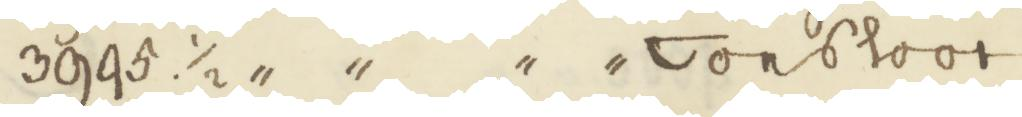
3945.½ „ „ „ „ Corsloot
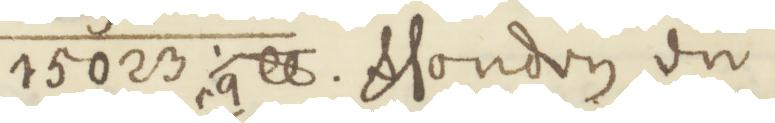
15023¼ lb. versonden en
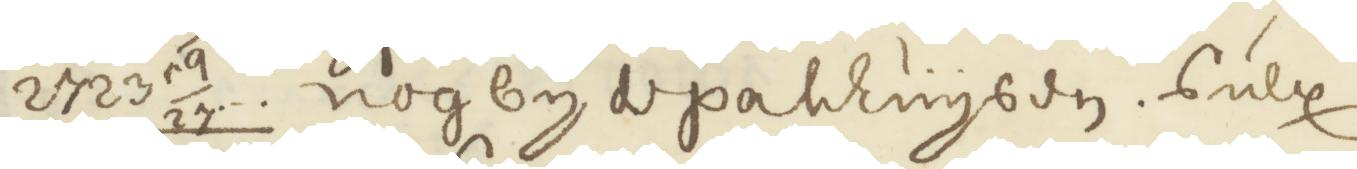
2723 5/27. - . nog bij de pakhuijsen. sulx
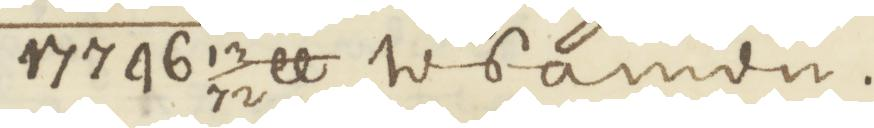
17746 13/72 lb tesamen
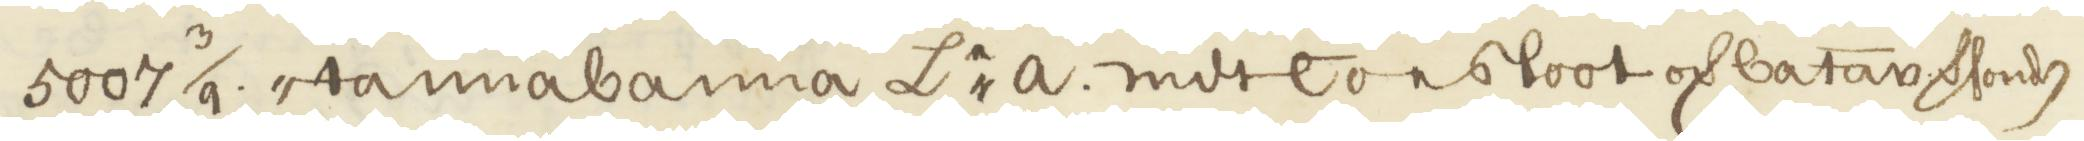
5007¾. „ tannabanna L„ra. met Corsloot over batav: versonden
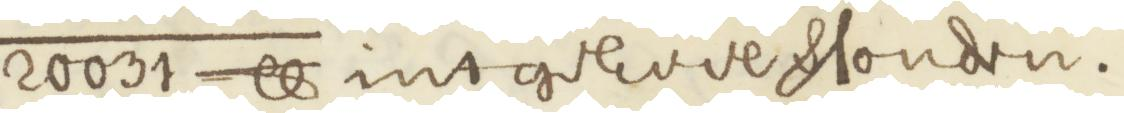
20031 lb int geheel versonden.
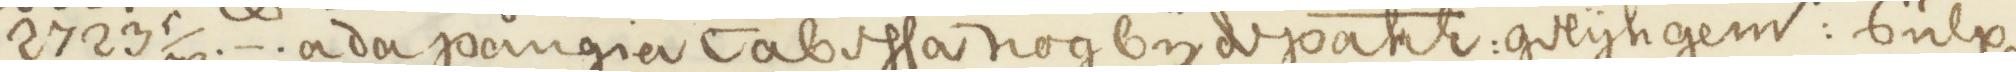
2723 5/72. - . ada pangia Cabessa nog bij de pakh: gelijk gem:t sulx
